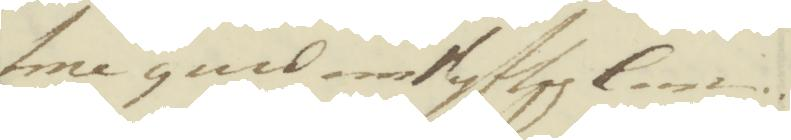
twee guldens Vyftig Cent „
